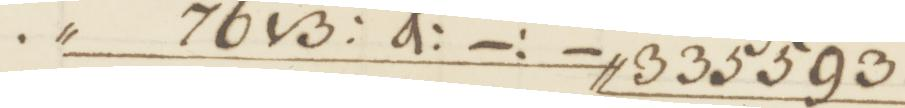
. „ 7613: 4: –: – „ 335593
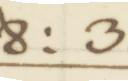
8: 3.
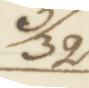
5/32
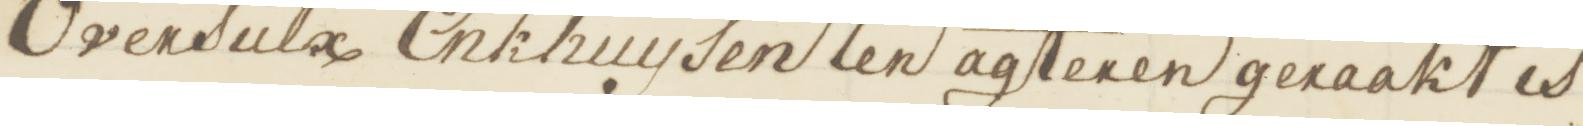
Oversulx Enkhuysen ten agteren geraakt is
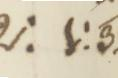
21: 1: 21/32
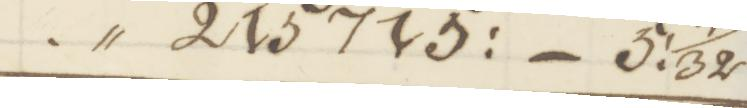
. „ 215715: – 5: 11/32
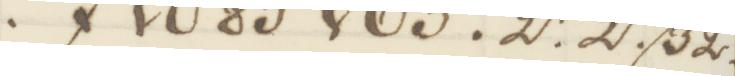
. ƒ 1085165: 2: 2: /32
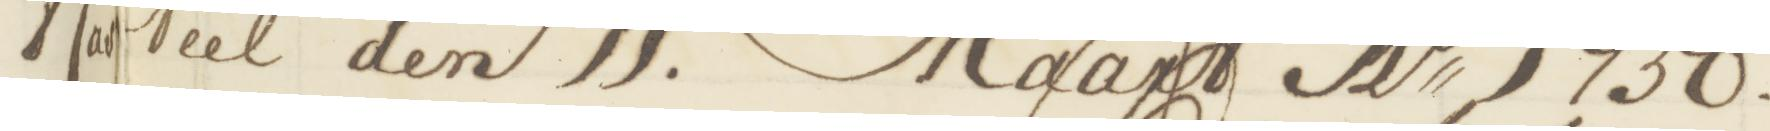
teel den 11. Maart A„o 1750.
